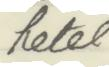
ketel
